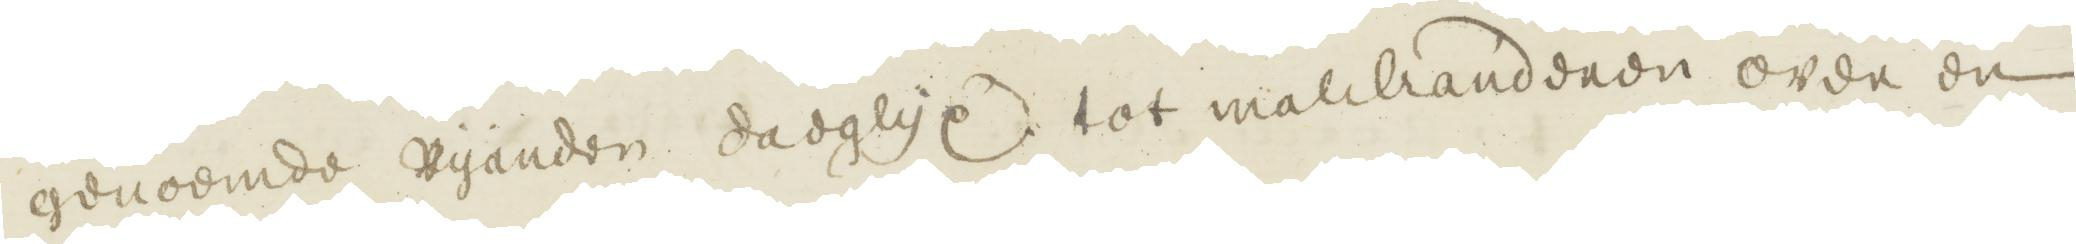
genoemde vijanden daeglijx tot malckanderen over en
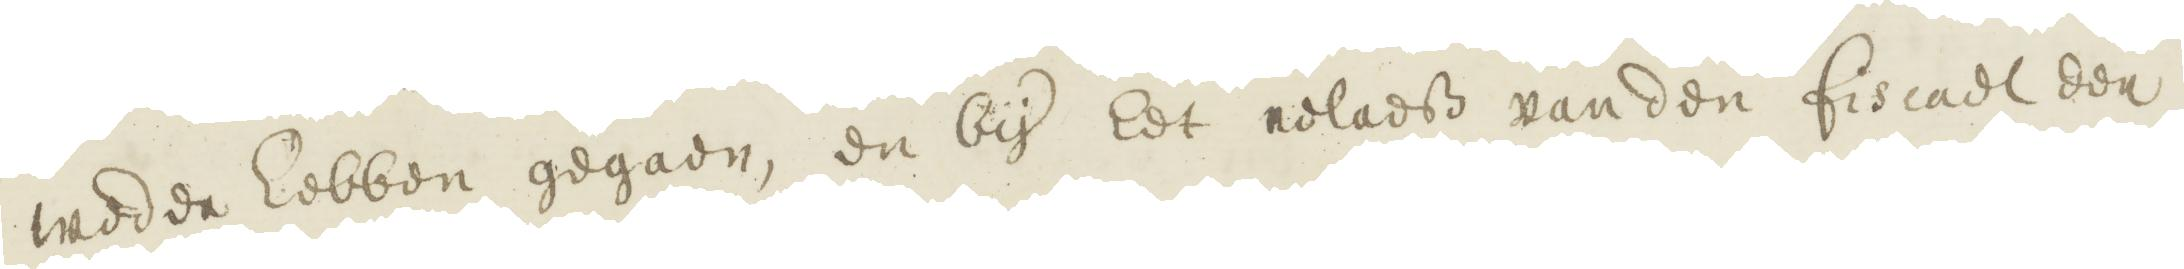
weder hebben gegaen, en bij het relaes van den fiscael der
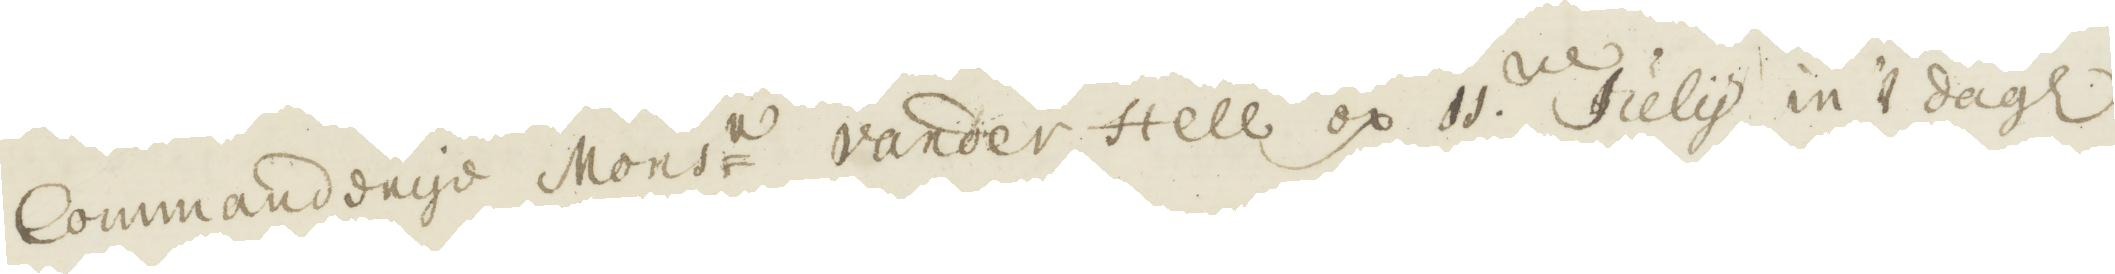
Commanderije Mons=r vander stell op 11.ve Julij in 't dagh
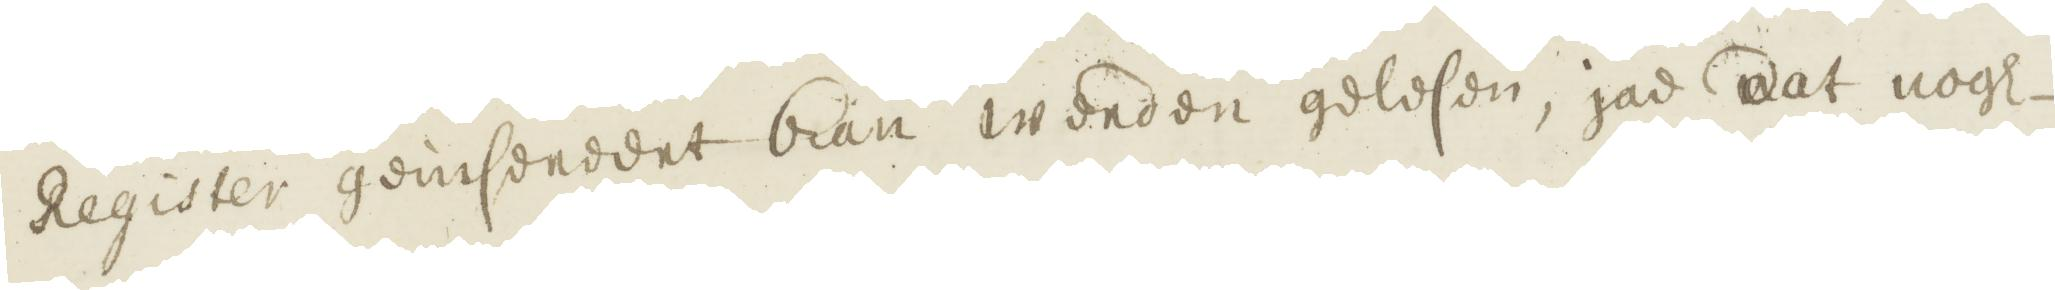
Register geinsereert kan werden gelesen, jae dat nogh
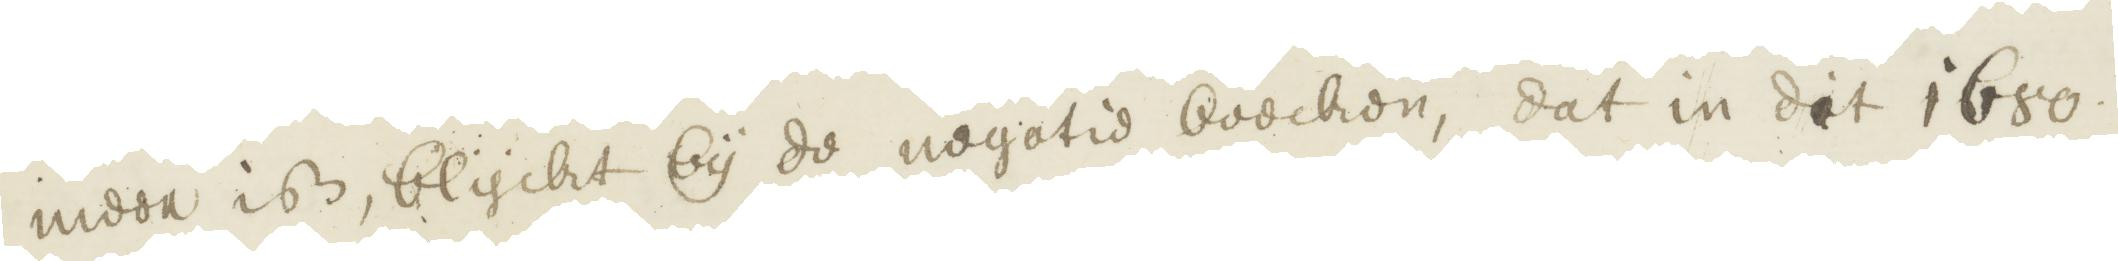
meer is, blijckt bij de negotie boecken, dat in dit 1680
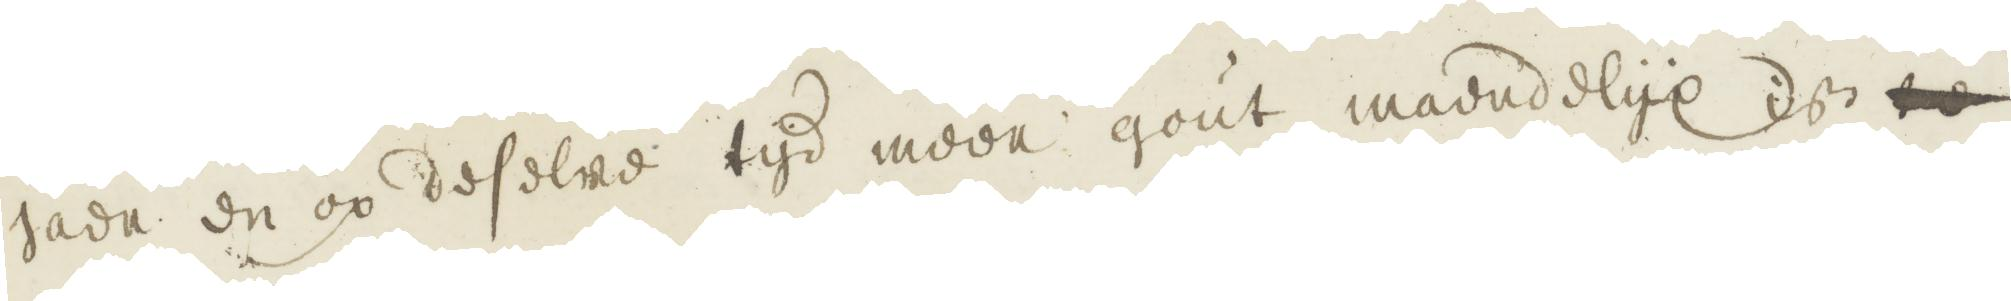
jaer en op deselve tijd meer gout maendelijx is te
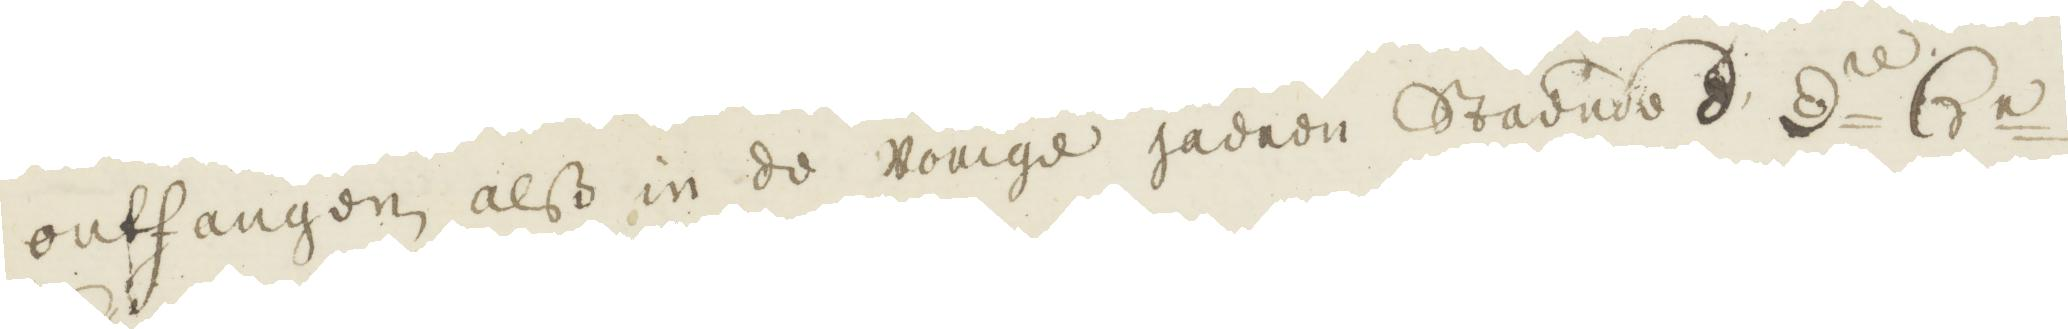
ontfangen als in de vorige jaeren Staende d' E=e H=r
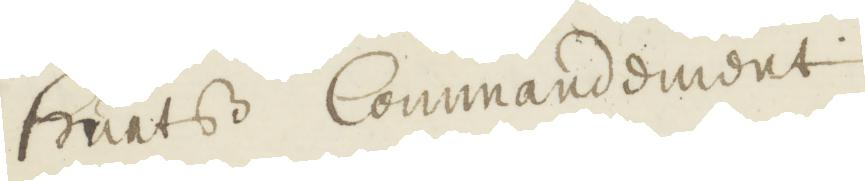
Hurts Commandement
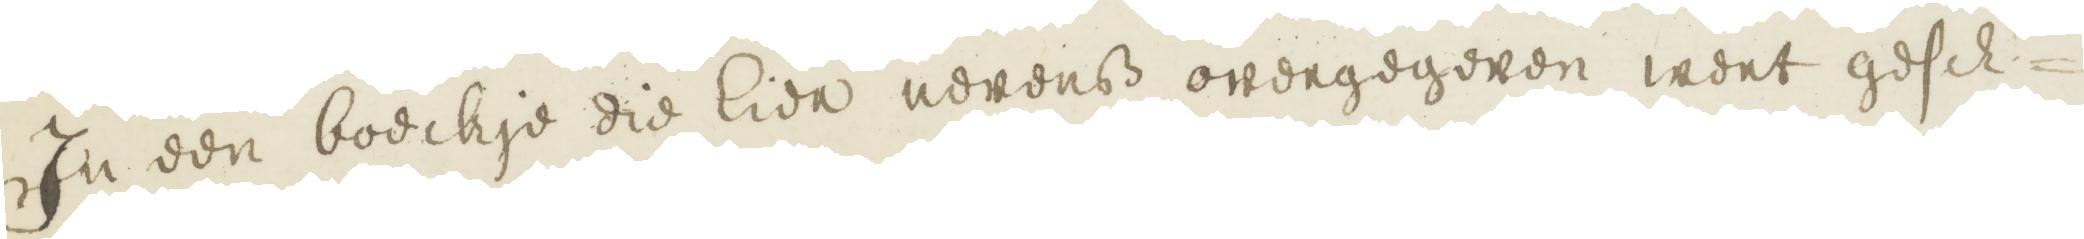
In een boeckje die hier nevens overgegeven wert gesch=
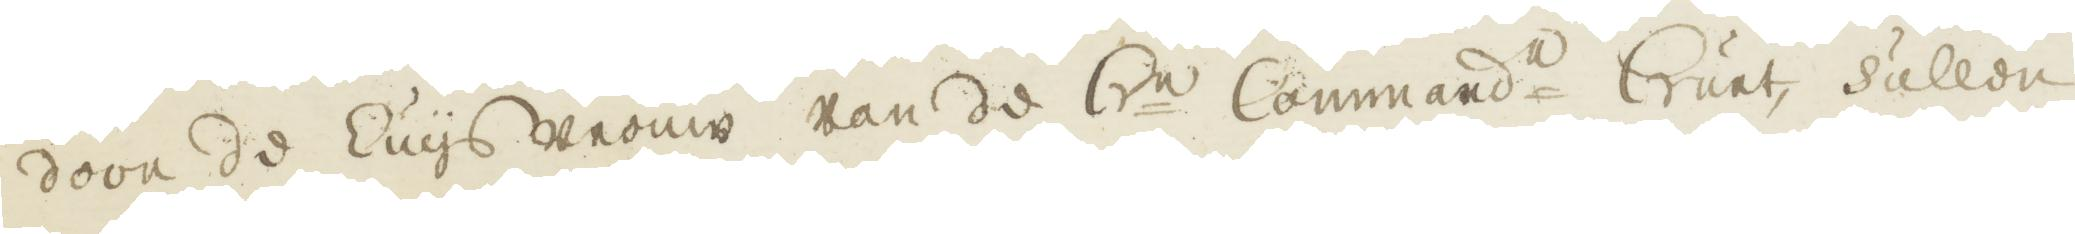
door de huijsvrouw van de H=r Command=r Hurt, sullen
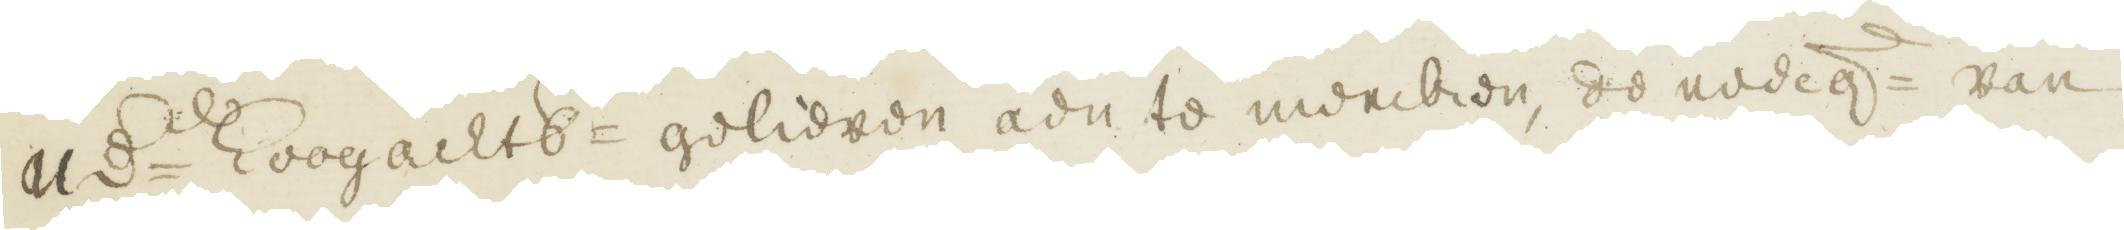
UE=e hoogachtb=n gelieven aen te mercken, de reecq=e van
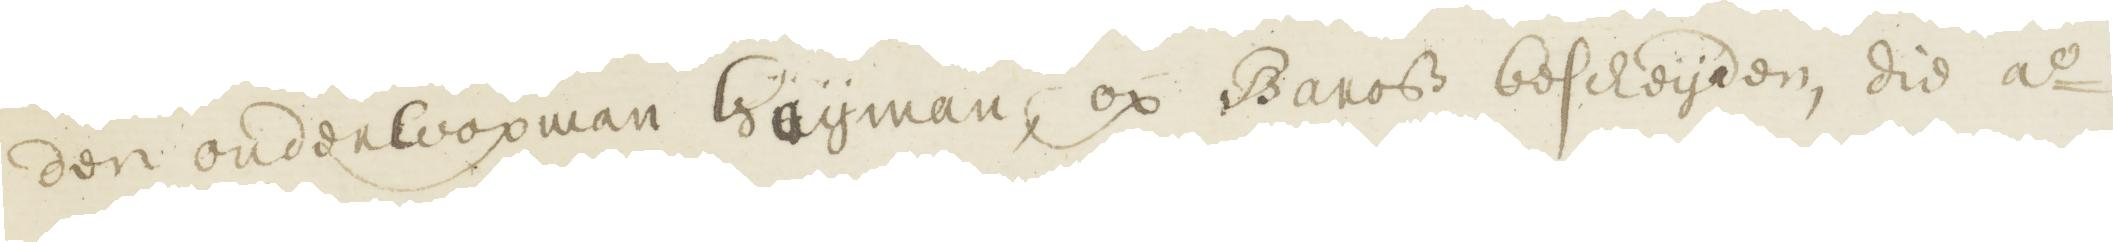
den ondercoopman Haijman, op Baros bescheijden, die a=o
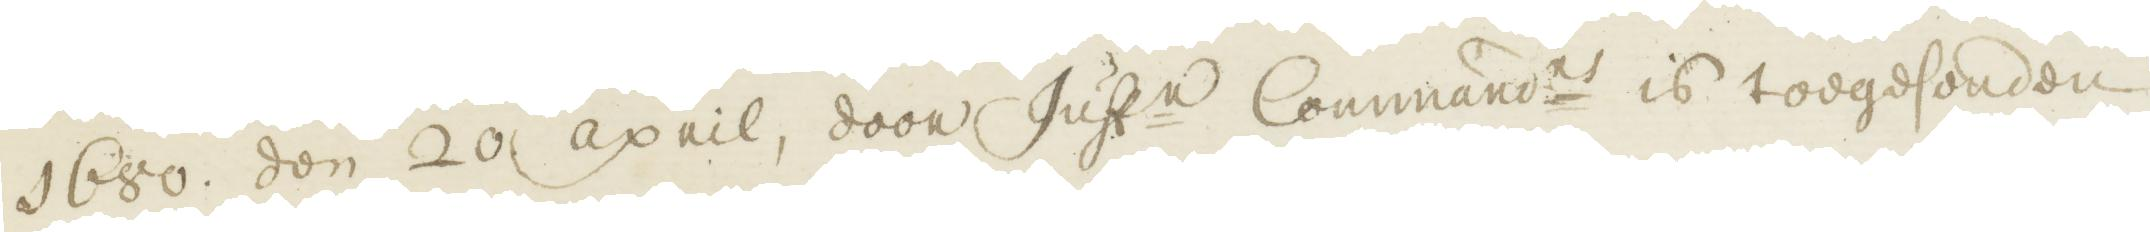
1680. den 20 april, door Just=r Command=rs is toegesenden
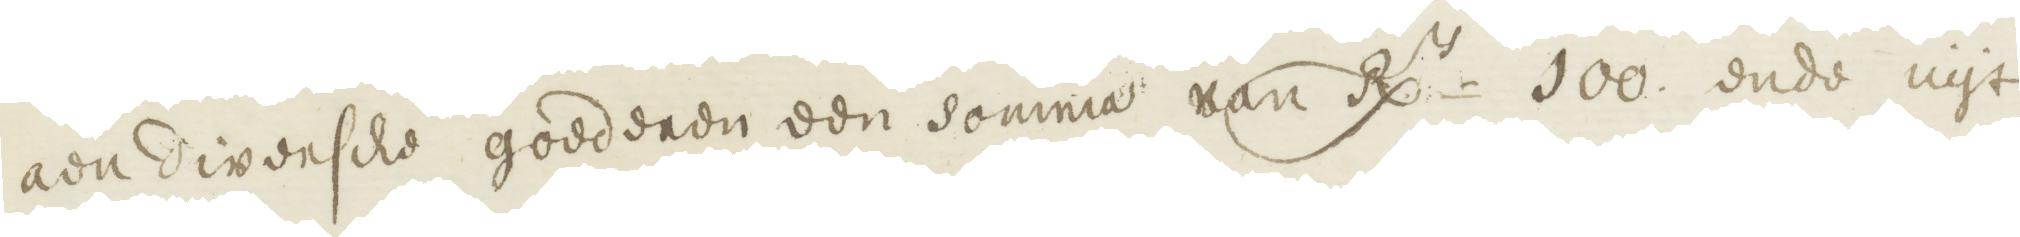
aen diversche goederen een somma van Rx=rs 100. ende uijt
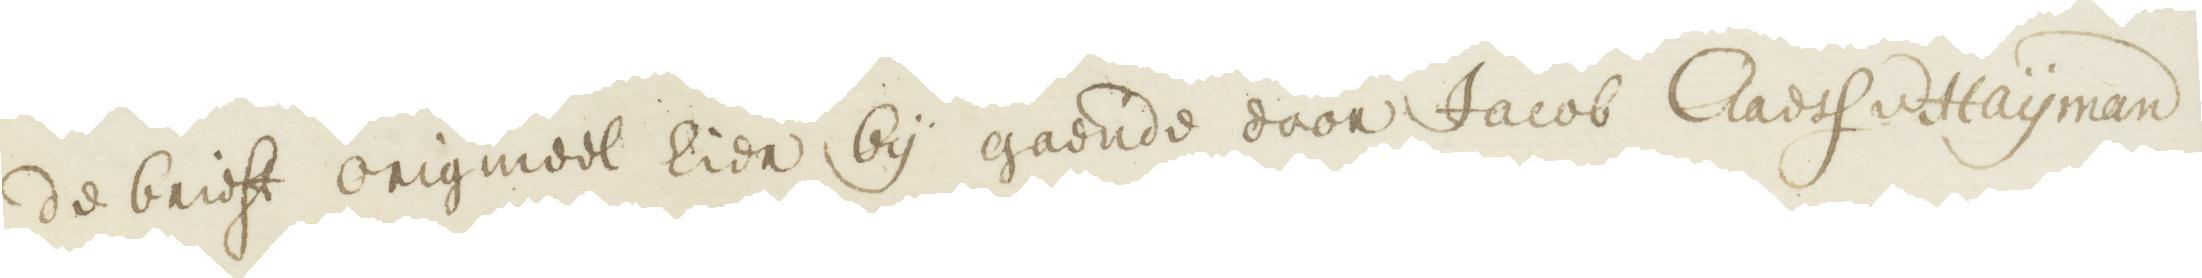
de brief origineel hier bij gaende door Jacob Claess en Haijman
